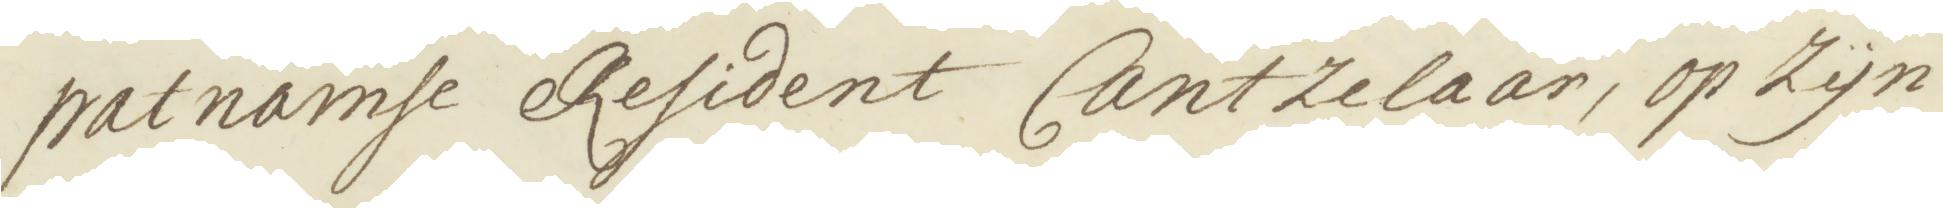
patnamse Resident Cantzelaar, op zijn
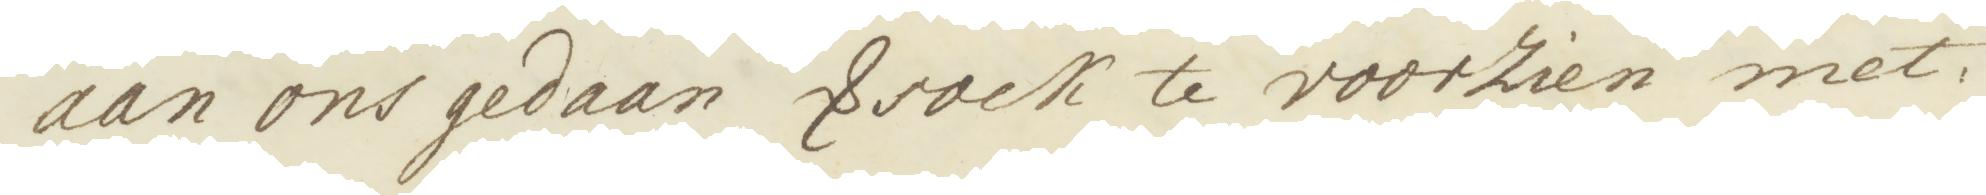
aan ons gedaan versoek te voorzien met:
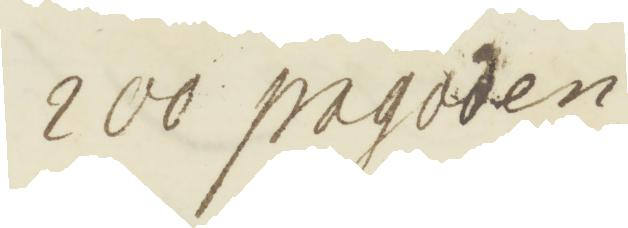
200 pagoden
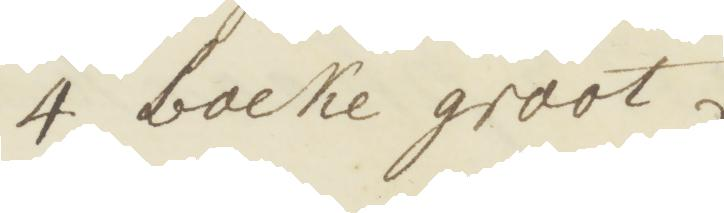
4 boeke groot
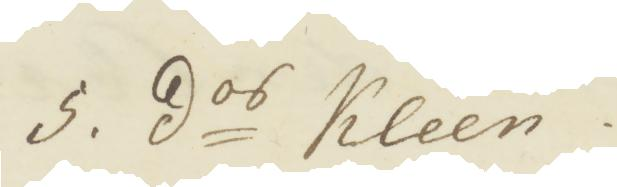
5. d=os kleen
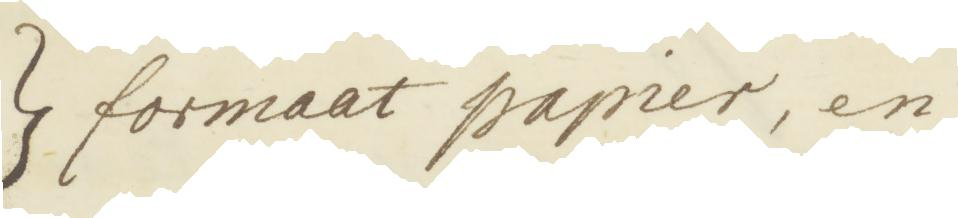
} formaat papier, en
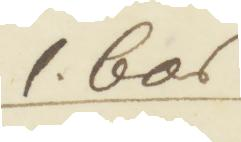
1. bos
